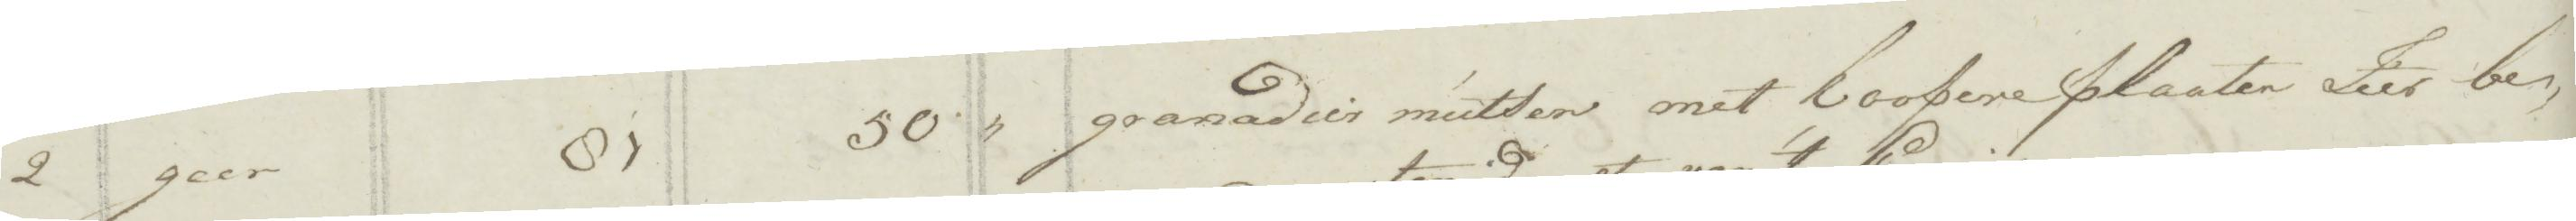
2 geer 81 50 „ granadier mutsen met koopere plaaten zeer be„
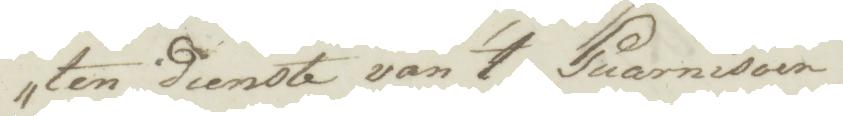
„ten dienste van ’t Guarnisoen
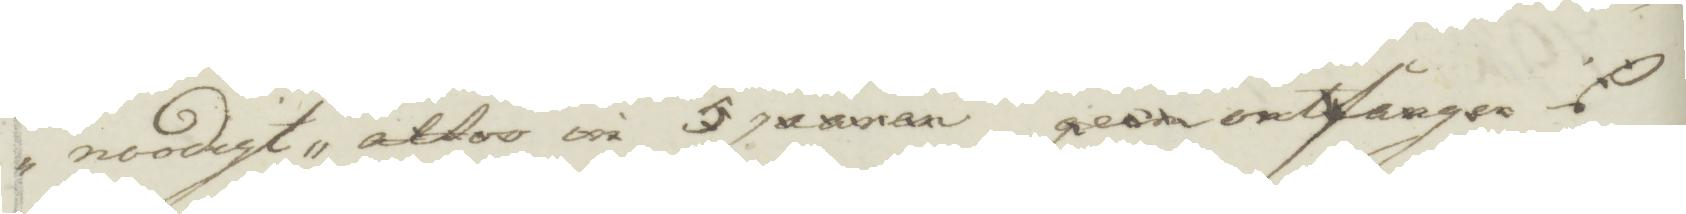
„noodigt„ alsoo in 5 jaaren geen ontfangen 's
